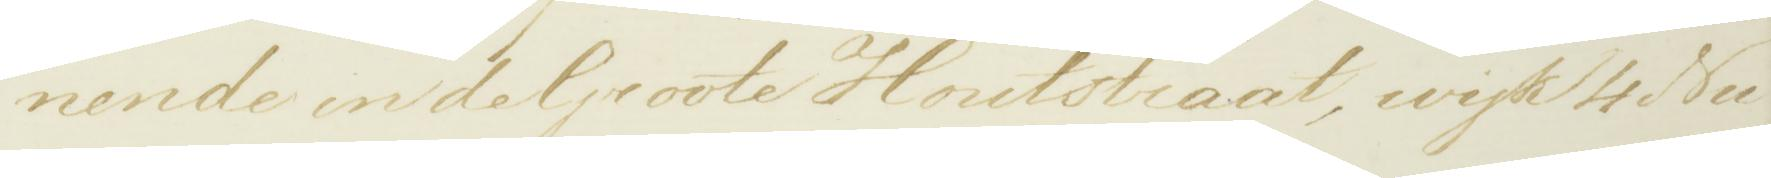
nende in de Groote Houtstraat, wijk 4 Nu
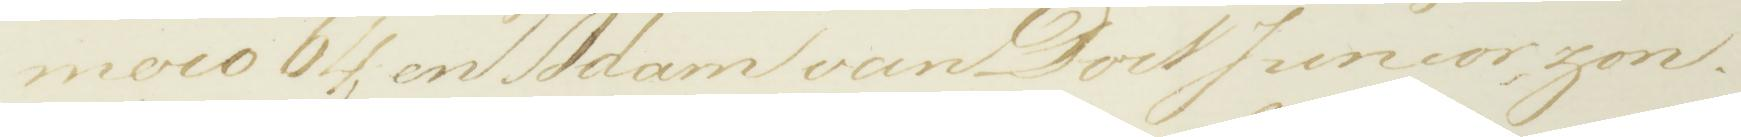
mero 64, en Adam van Dort Junior, zon„
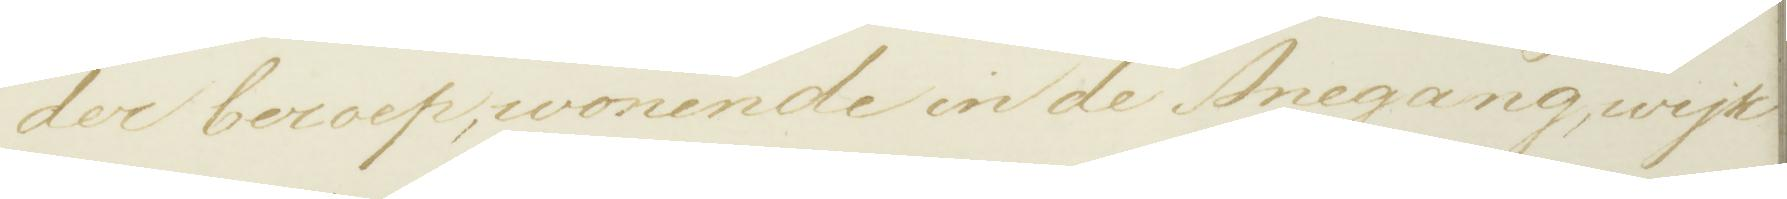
der beroep, wonende in de Anegang, wijk
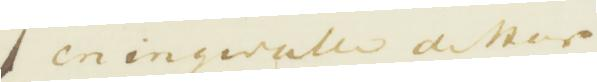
¶ en ingevalle de Heer
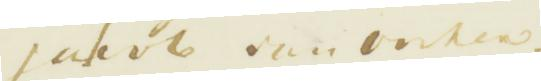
Jakob van Ooster„
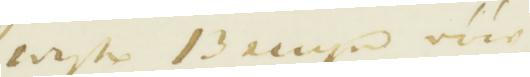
wijk Bruijn vóór
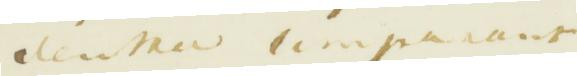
den heer Comparant
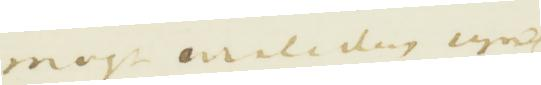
mogt overleden zyn
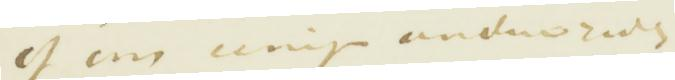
of om eenig andere reden
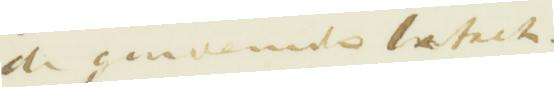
de genoemde betrek,
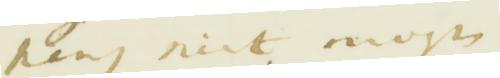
king niet mogt
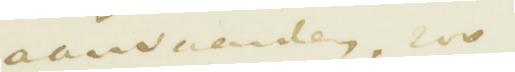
aanvaerden, zoo
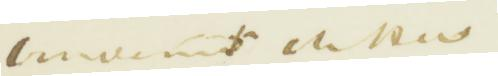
benoemt de heer
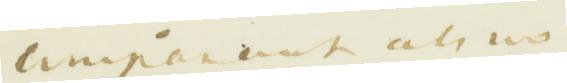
comparant als zo
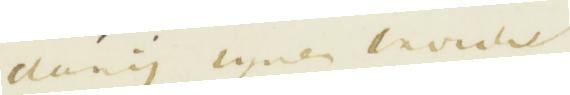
danig zynen broeder
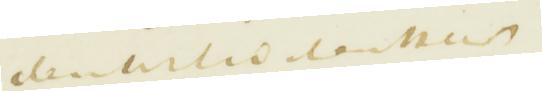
den weledelen heer
